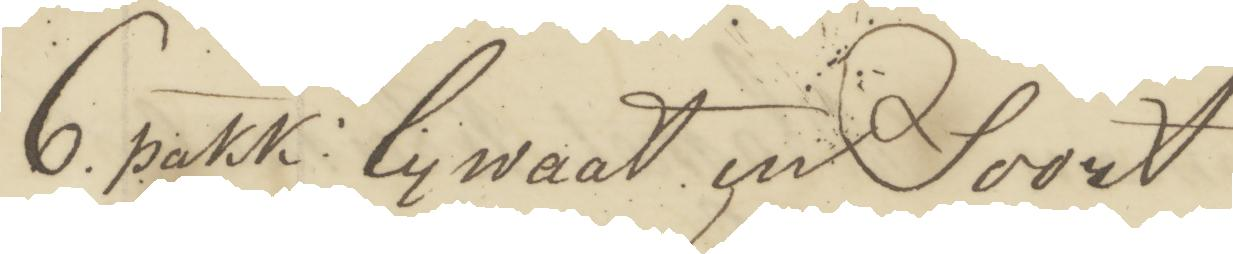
6. pakk: lijwaat in Soort
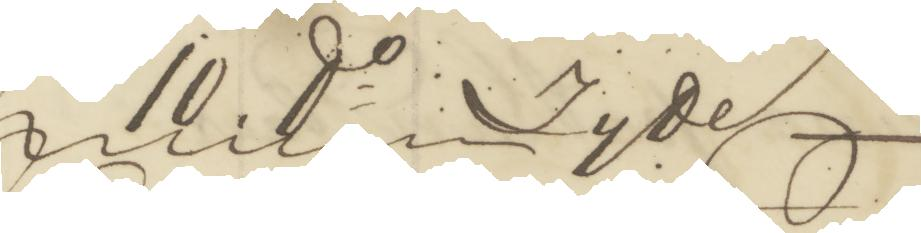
10. d=o Zijde -
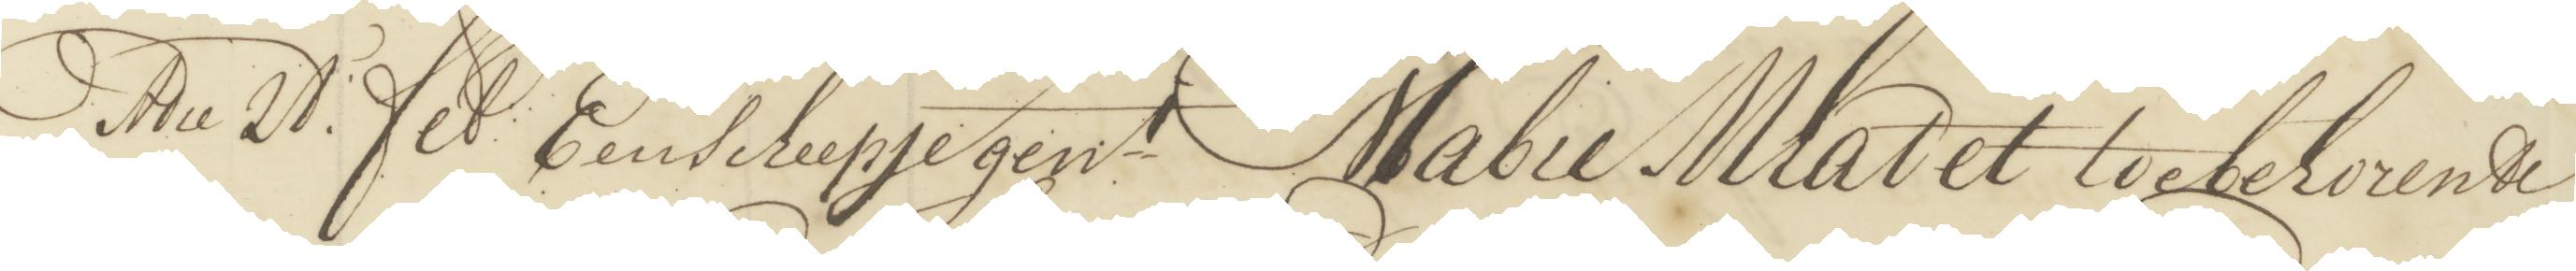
Adie 28:' feb: Een scheepje gen:t Mabie Mlatet toebehorende
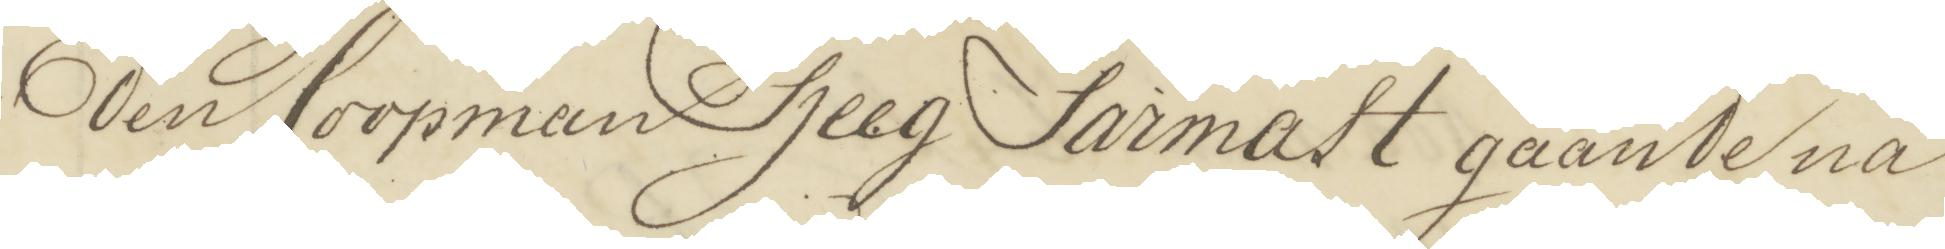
den Coopman Sjeeg Sarmast gaande na
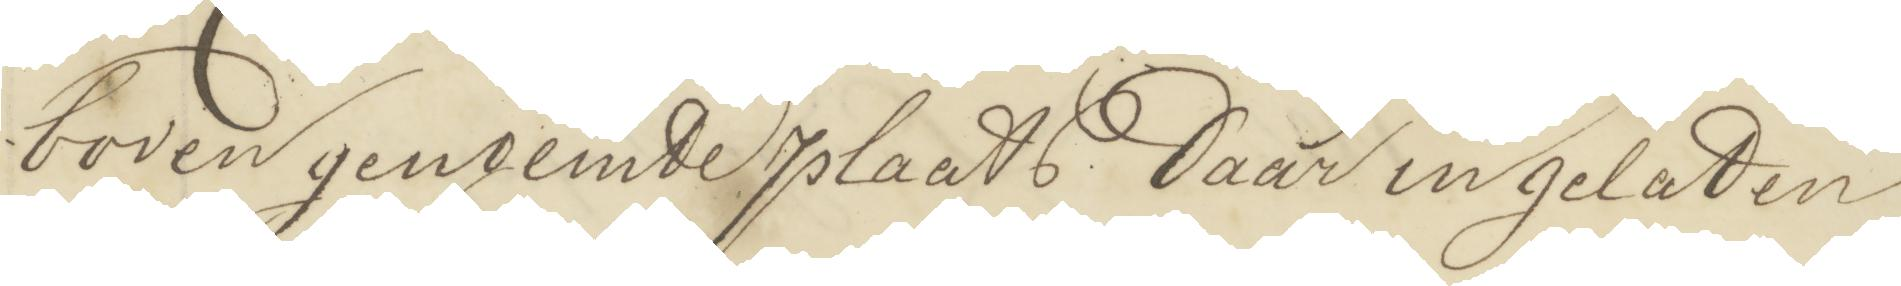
boven genoemde plaats daar ingeladen
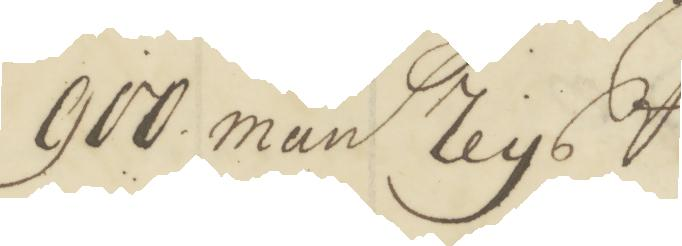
900. man reijst
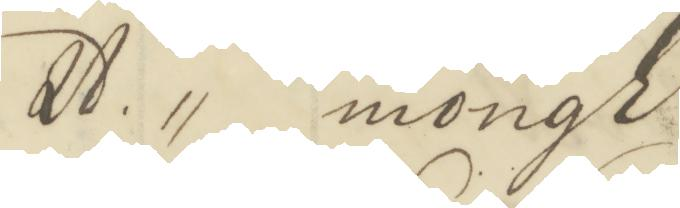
28. „ mongh
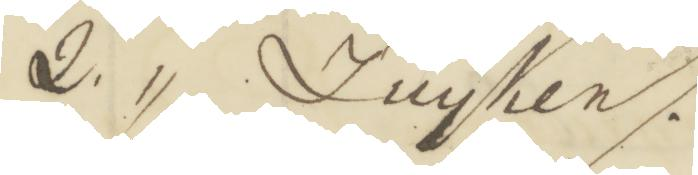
2. „ Zuijker
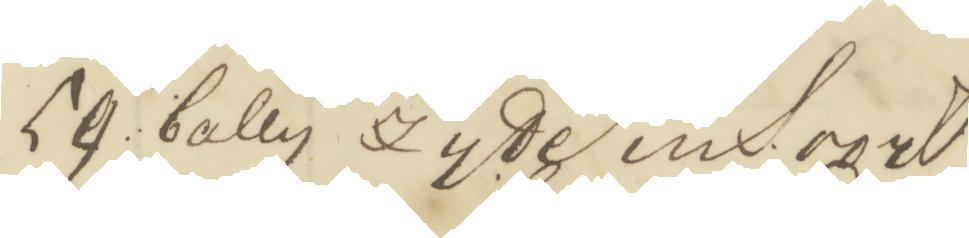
59: balen zyde in Soort
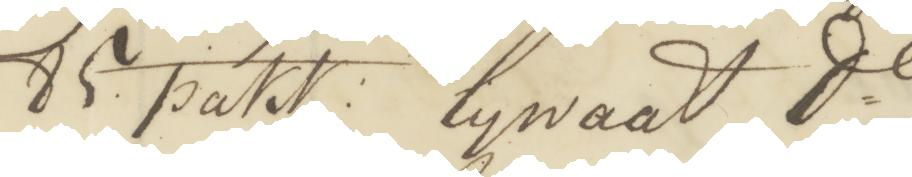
85. pakk: lijwaat d=o
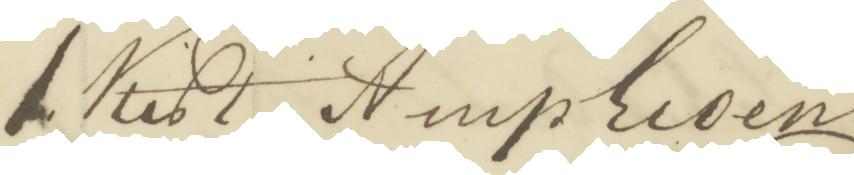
1 kist Amphioen
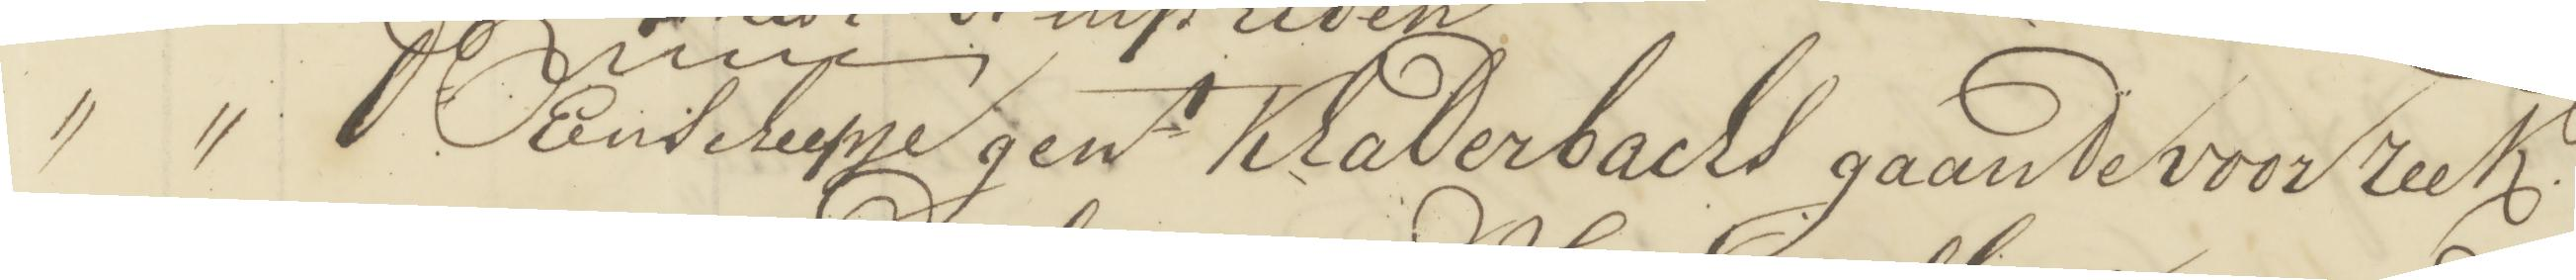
„ „ d=o Een Scheepje gen:t Kladerbachs gaande voor reek:
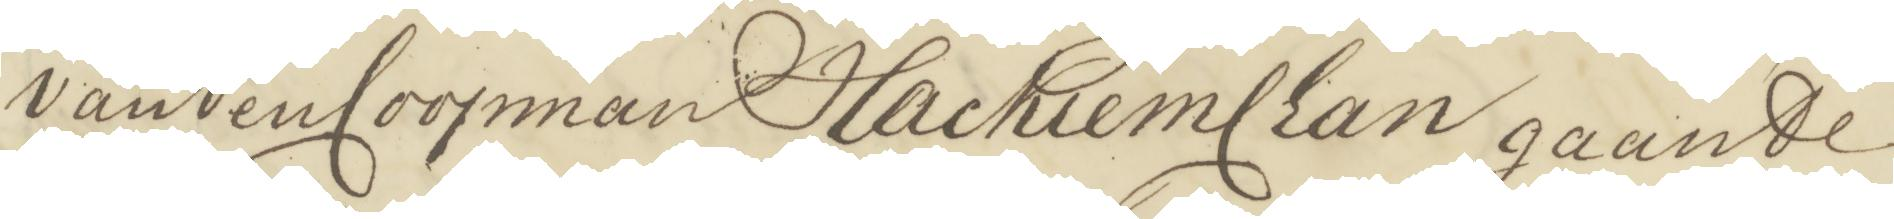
van den Coopman Hackiemchan gaan de
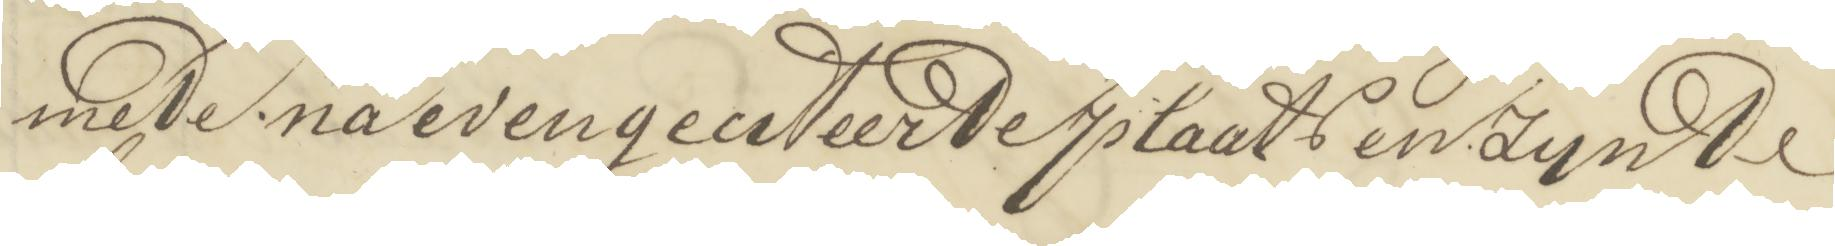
mede na even geciteerde plaats en zijnde
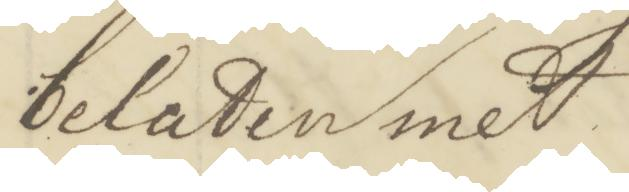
beladen met
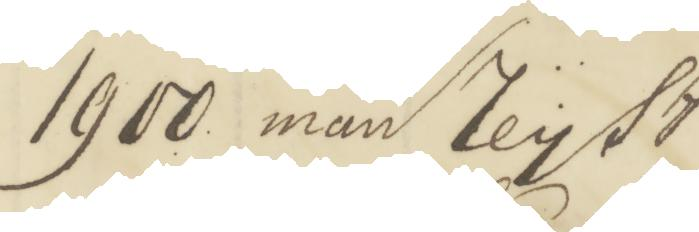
1900. man reijst
